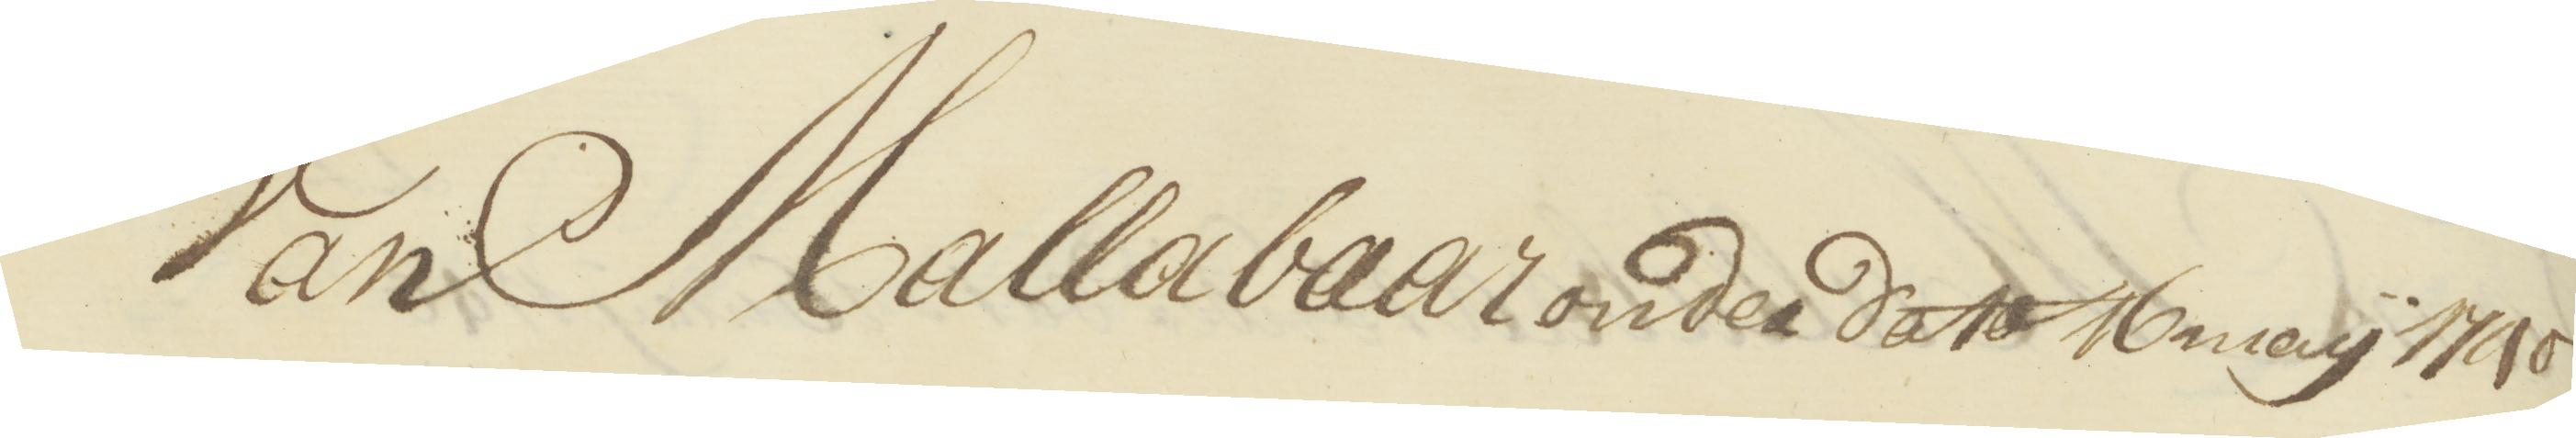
Van Mallabaar onder dato 16 Maij 1740
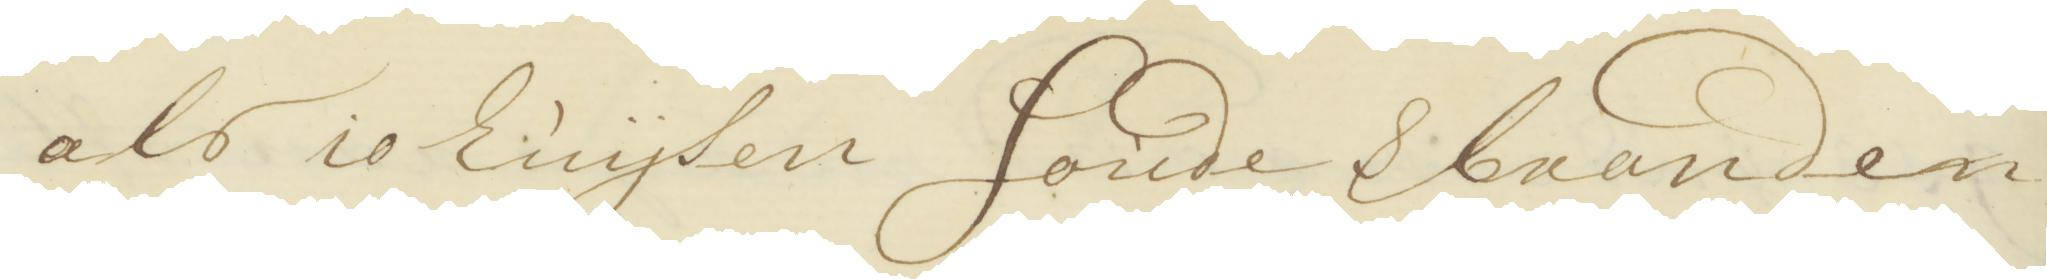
als is huijsen soude verbranden
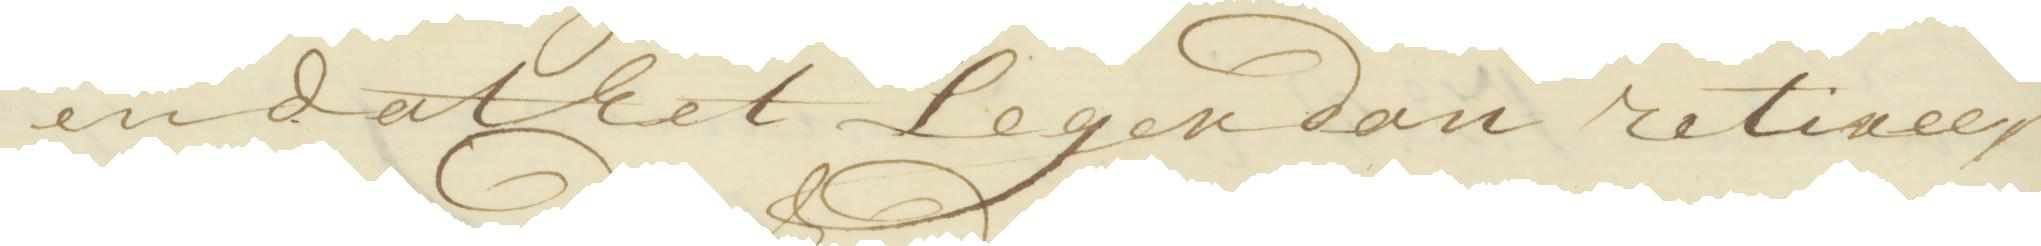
en dat het leger dan retiree
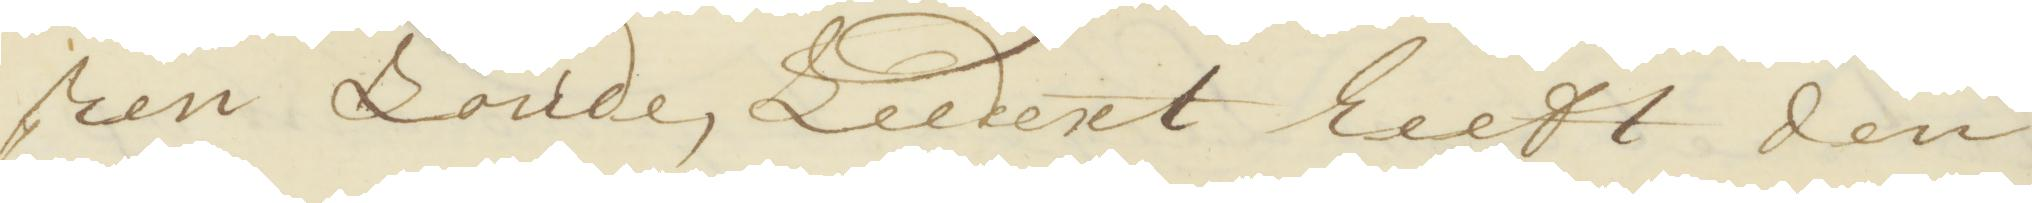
ren zoude, zeedert heeft den
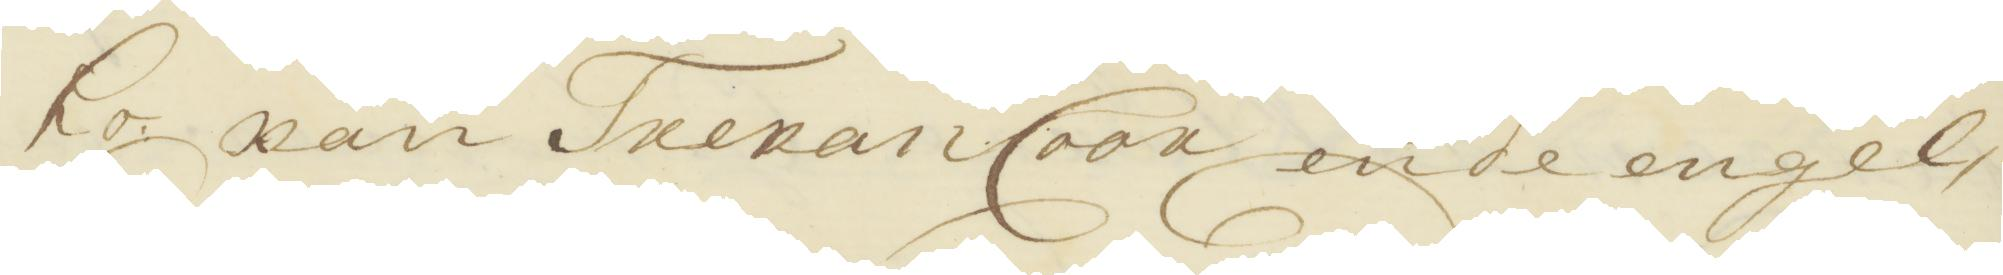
ko: van Trevancoor en de engel,
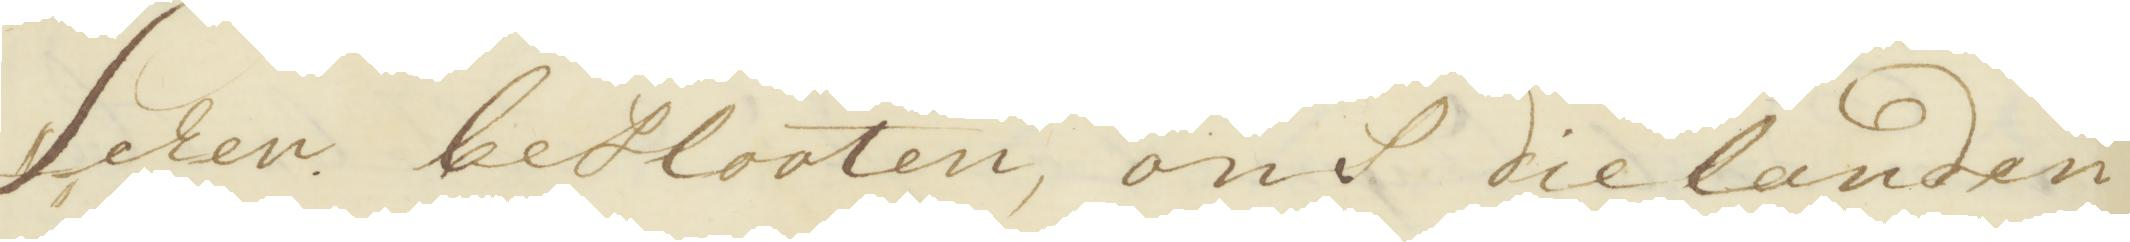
„schen beslooten, ons die landen
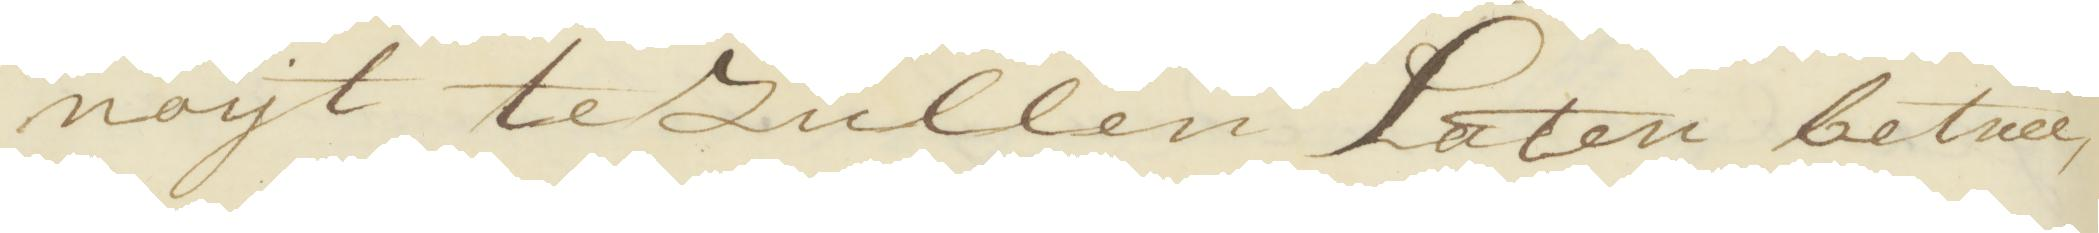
noijt te zullen laten betree,
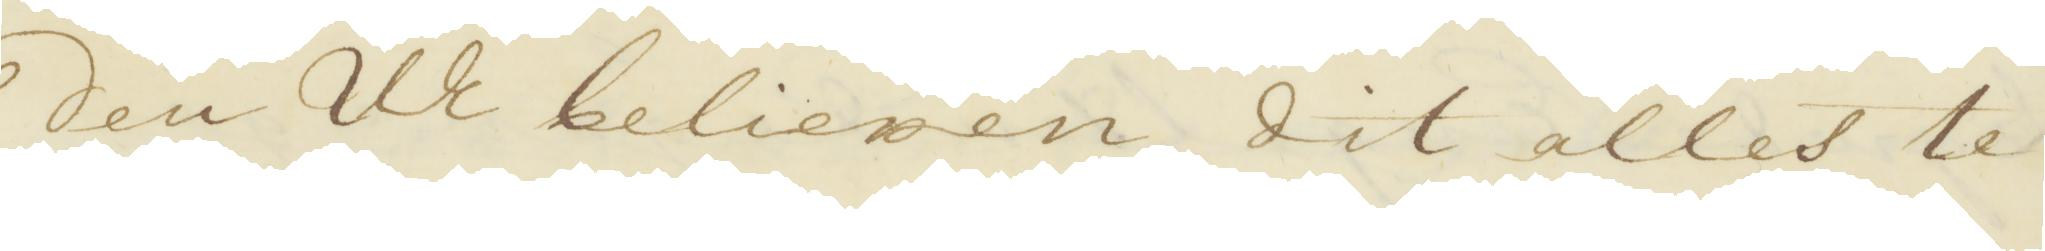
den UE believen dit alles te
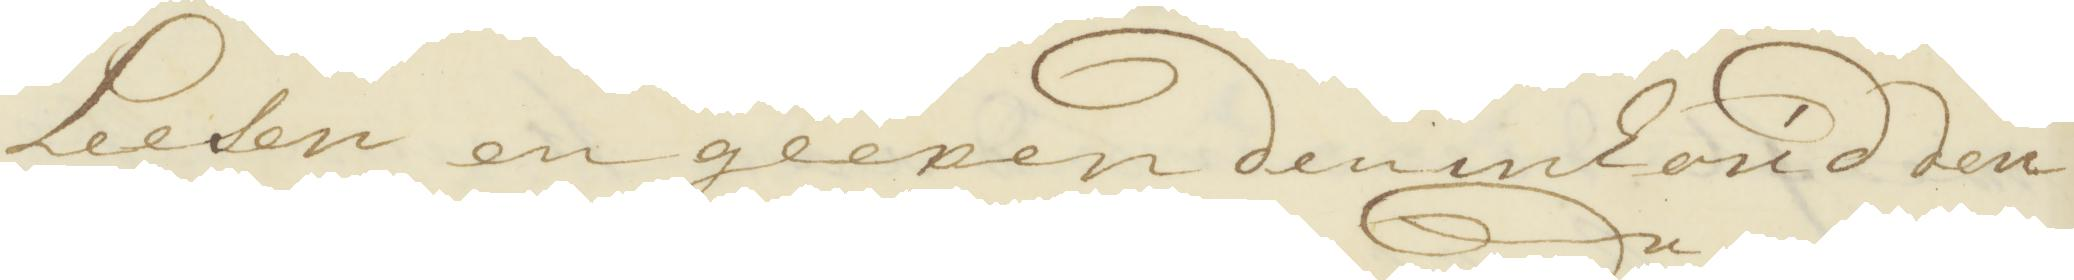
leesen en geeven den inhoud den
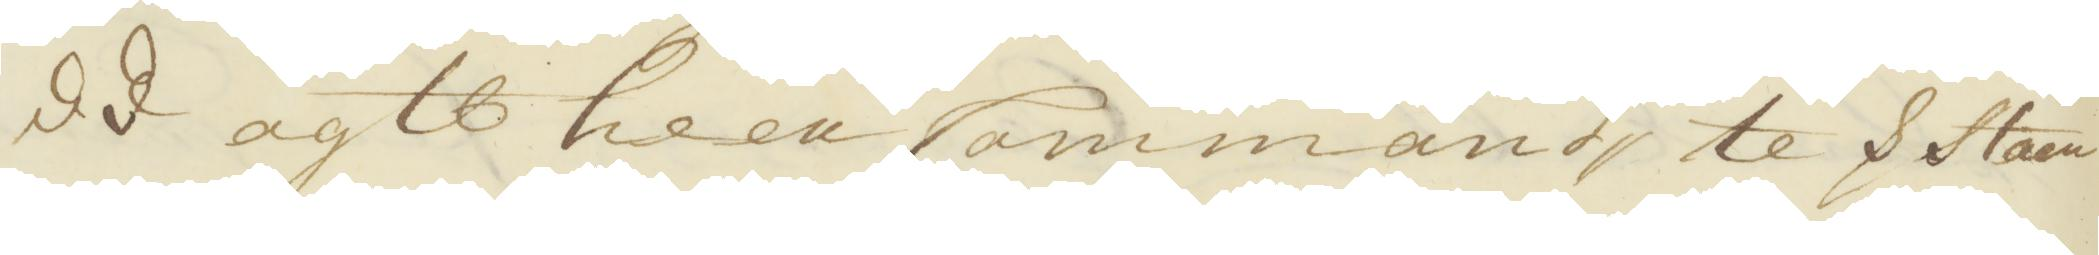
EE agtb heer Command„r te verstaen
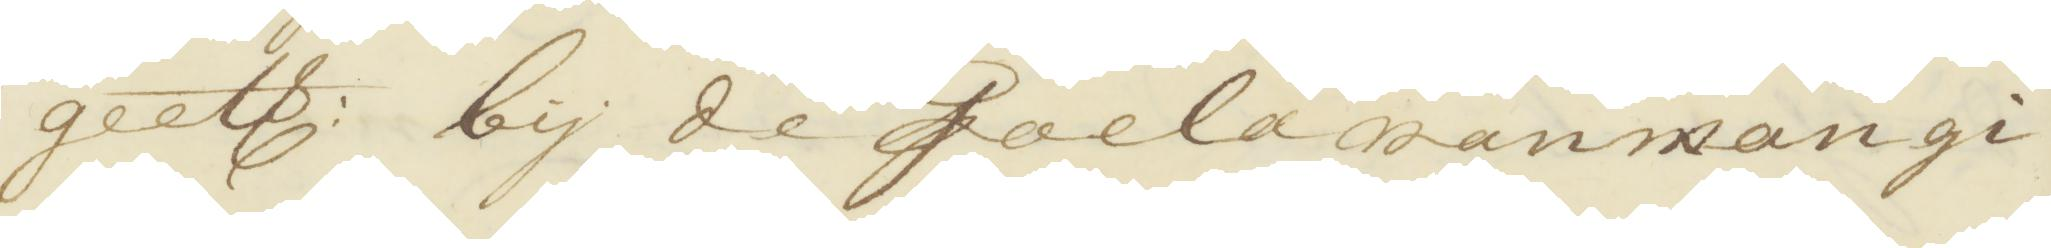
geetver: bij de poela vanmangi
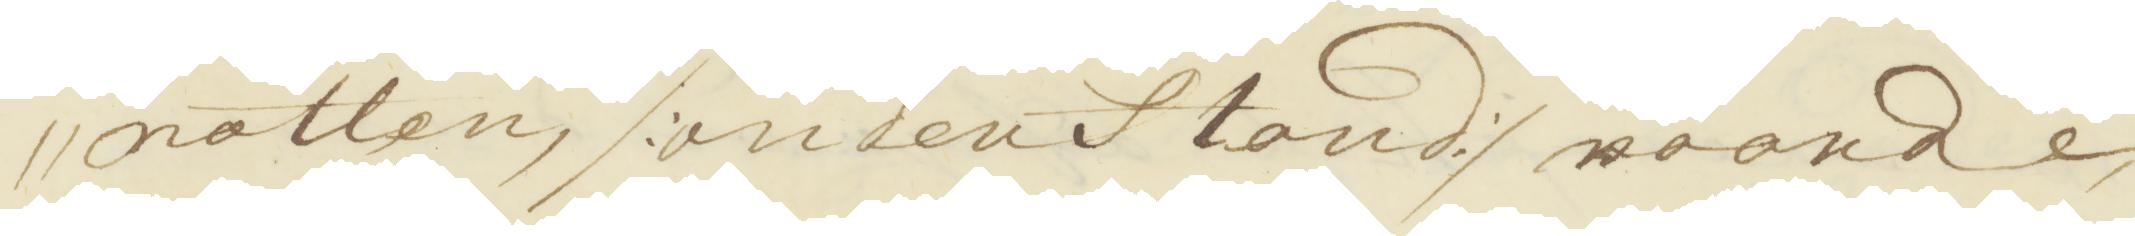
„notten, /:onderstond:/ voor de,
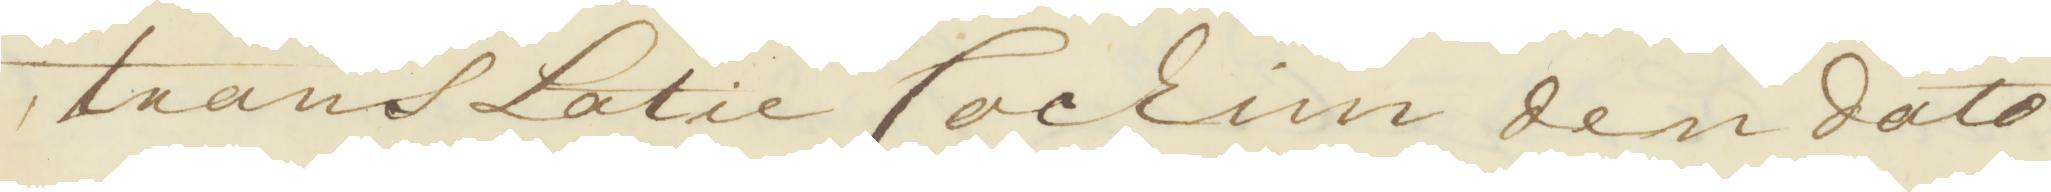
translatie Cochim den dato
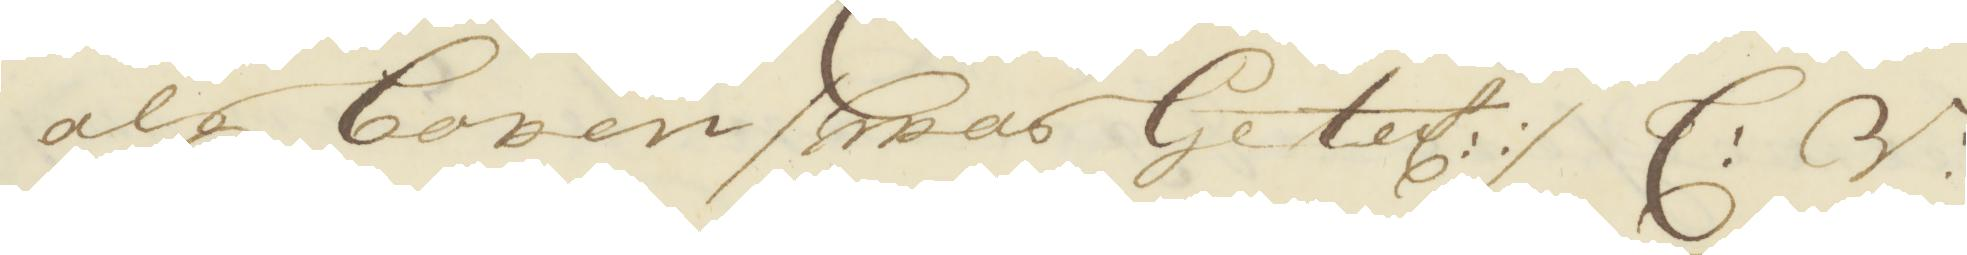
als boven /was Getec:t:/ C: V:
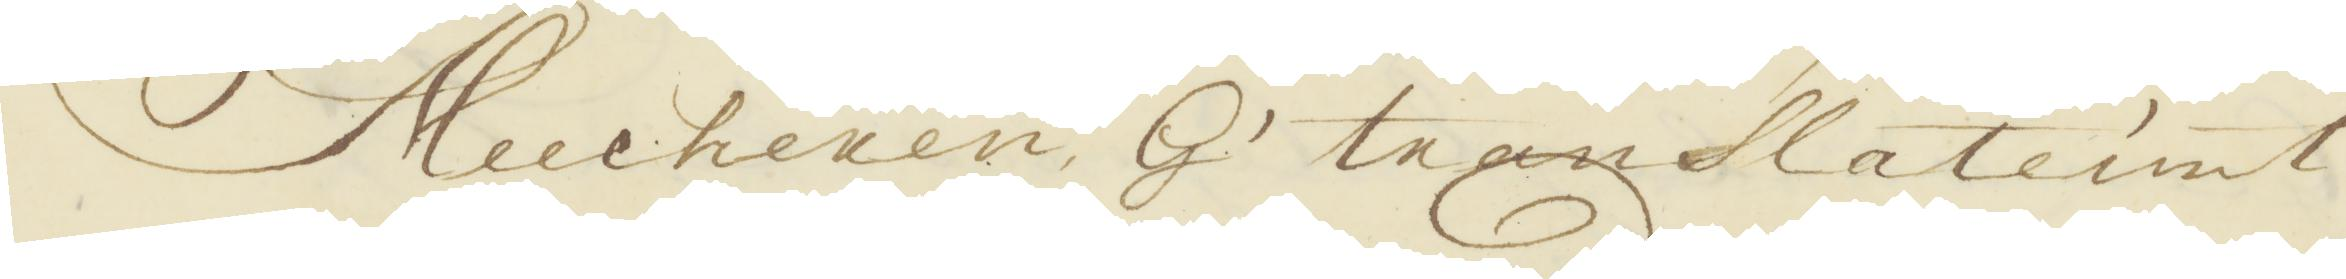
Meeckeren, G' translateurt
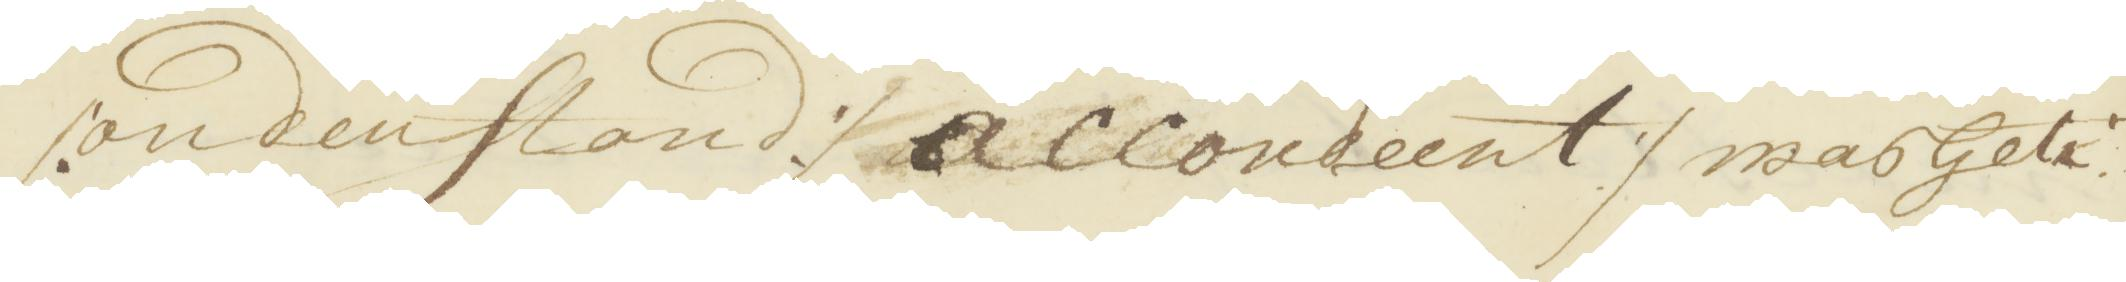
/.onderstond:/ accordeert :/ was Gete.t
